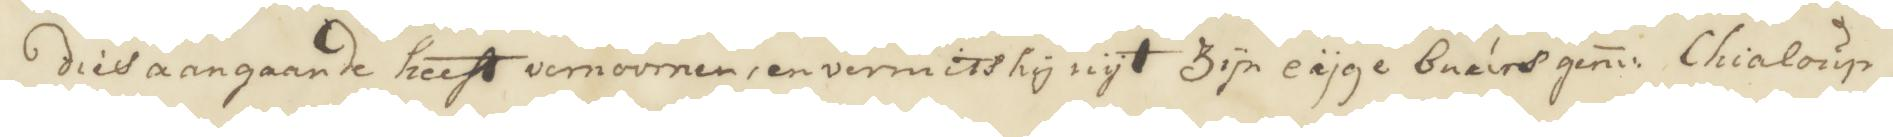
dies aangaande heeft vernoomen, en vermits hij uijt Zijn eijge beurs gem: Chialoup
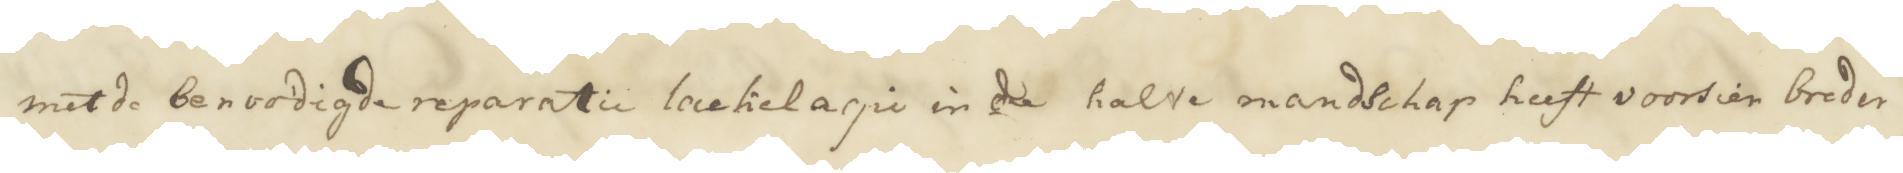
met de benoodigde reparatie laekelagie in die halve mandschap heeft voorsien breder
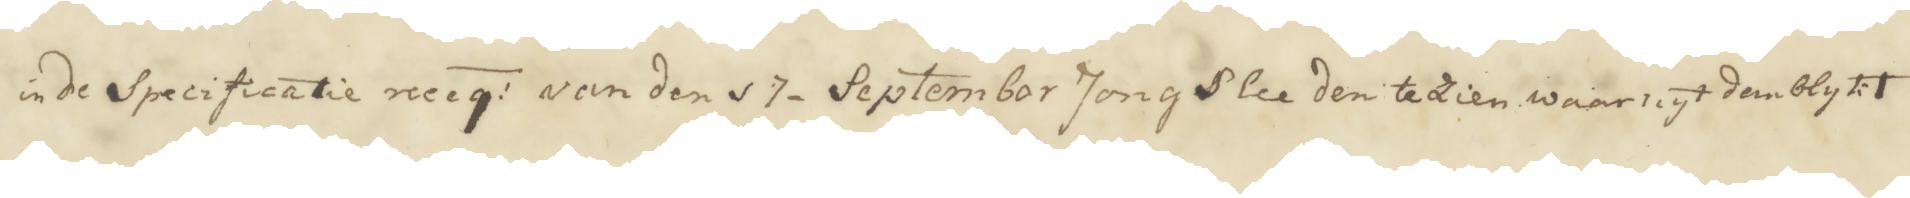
in de specificatie recq: van den 17- September Jongsleeden te zien waar uyt dan blykt
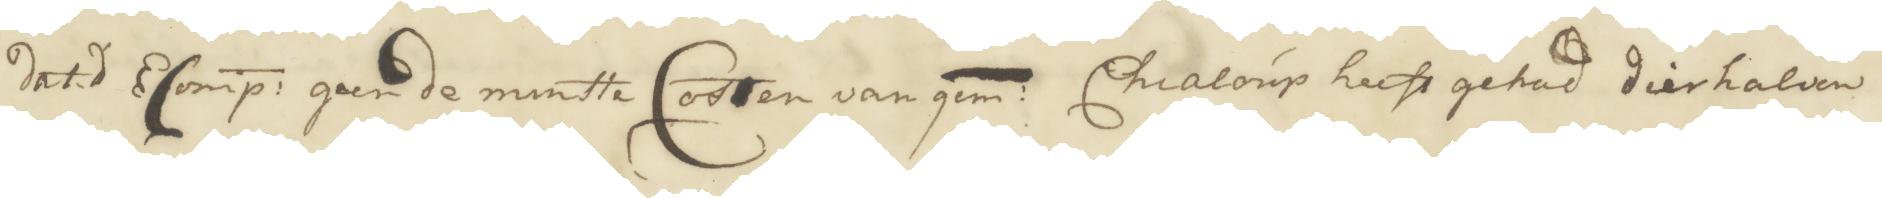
dat d' E Comp: geen de minste Costen van gem: Chialoup heeft gehad dier halven
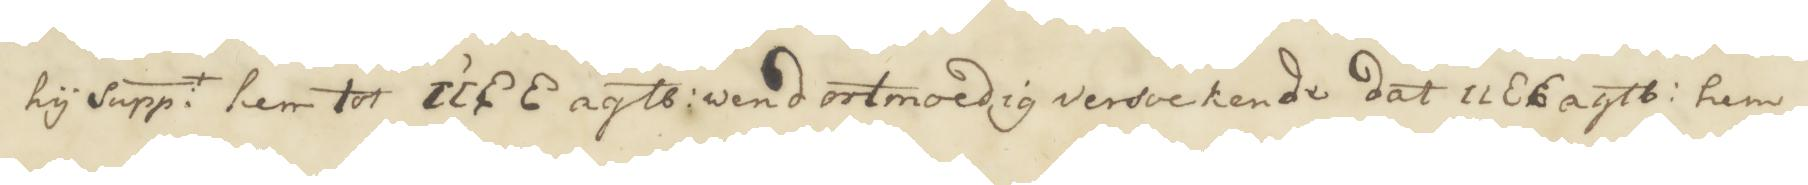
hij supp:t hem tot UE E agtb: wend ootmoedig versoekende dat uE E agtb: hem
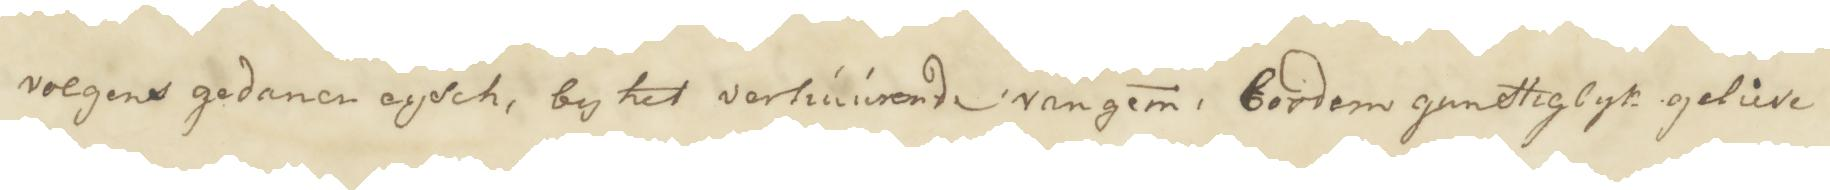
volgens gedanen eysch, bij het verhuurende van gem: boodem gunstiglyk gelieve
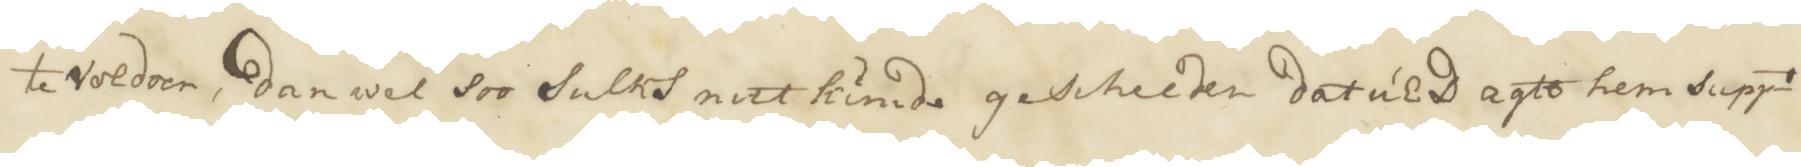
te voldoen, dan wel soo sulks niet kunde geschieden dat uE D agtb hem supp=t
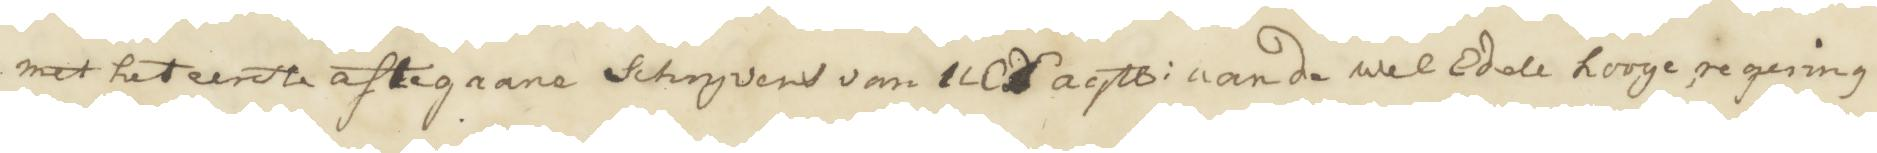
met het eerste aftegaane schryvens van UE E agtb: aan de wel Edele hooge regering
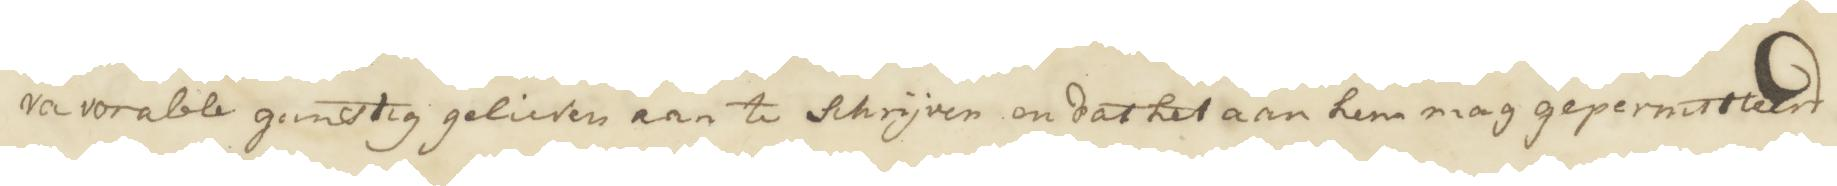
vavorable gunstig gelieven aan te schrijven en dat het aan hem mag gepermitteerd
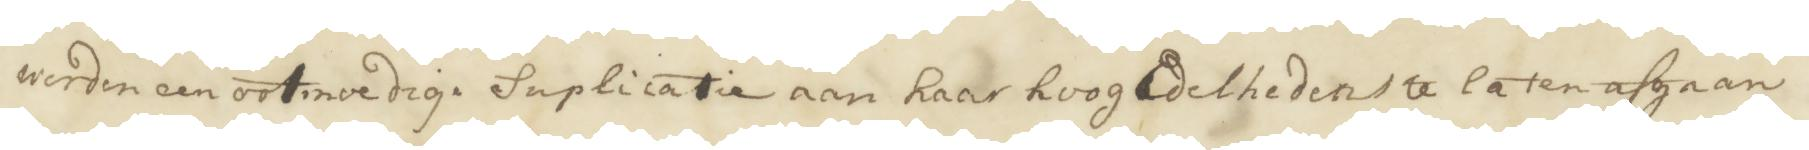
werden een ootmoedige suplicatie aan haar hoog Edelhedens te laten afgaan
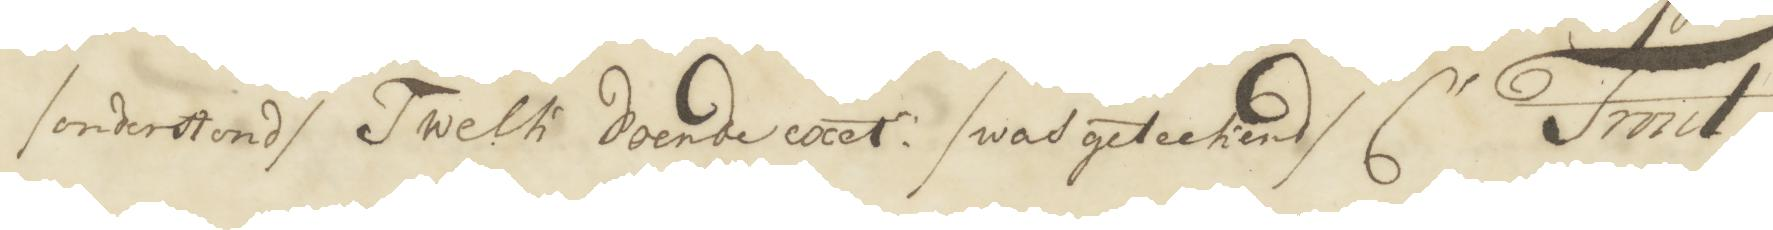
/onderstond/ T welk doende uw et:a /was geteekend/ C'Trout
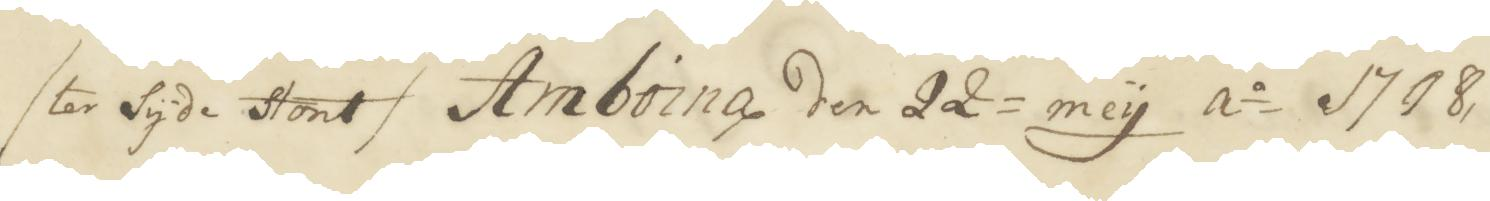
/ter Sijde stont/ Amboina den 22= meij a=o 1748.
